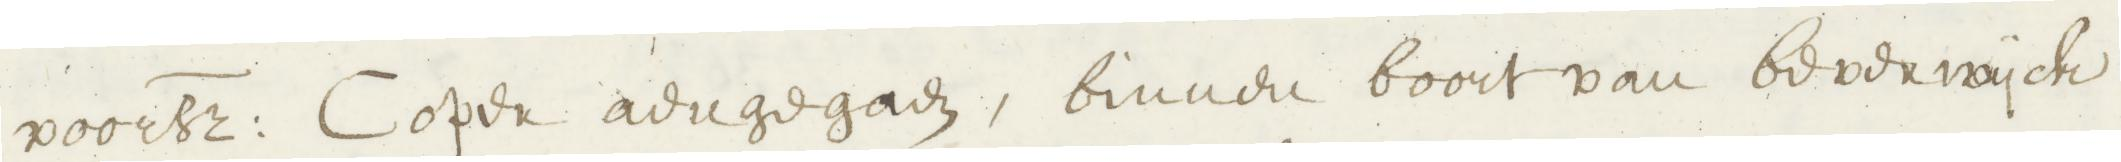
voorsz: Coper aengegaen, binnen boort van beverwijck
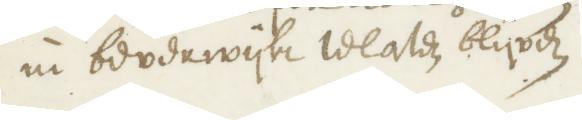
in beverwijk telaten blijven
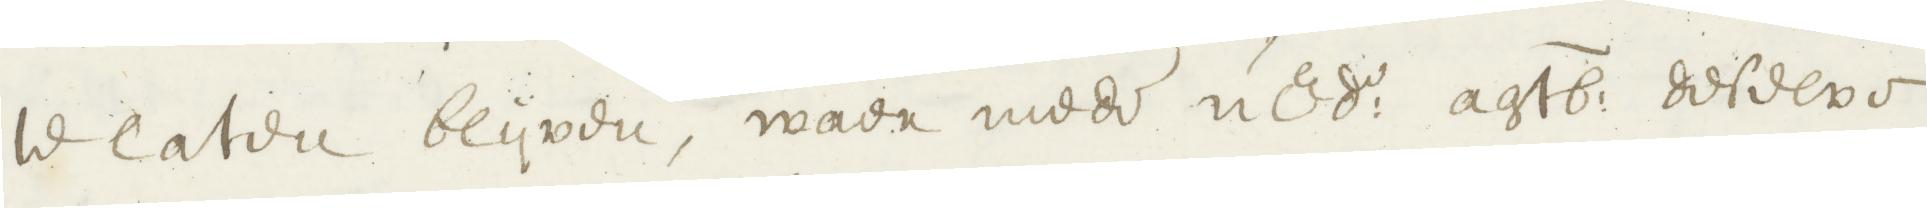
te laten blijven, waer mede uEd: agtb: deselve
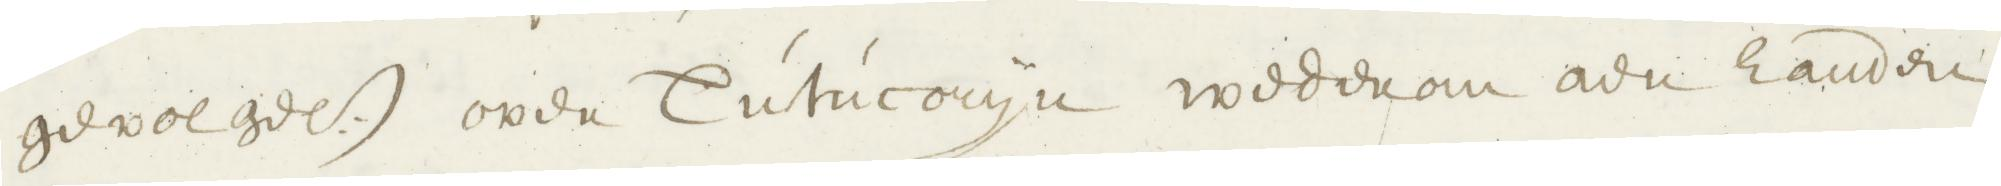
gevolgelijk over Tutucorijn wederom aen handen
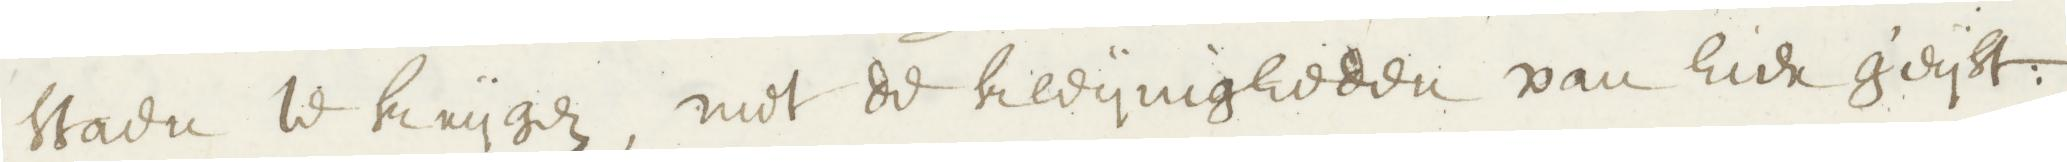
staen te krijgen, met de kleijnigheden van hier geijst:
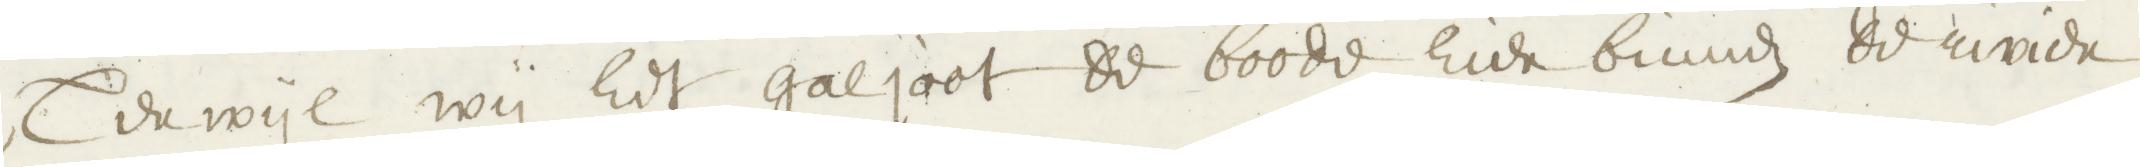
Terwijl wij het galjoot de boode hier binnen de rivier
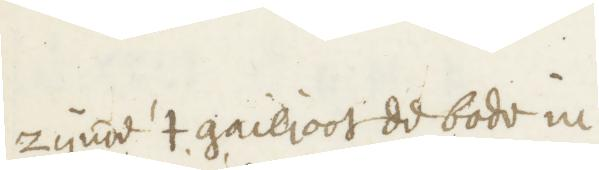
zijnde ’t gailjoot de bode in
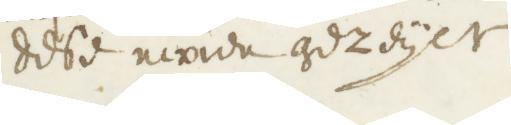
dese rivier gezeijlt
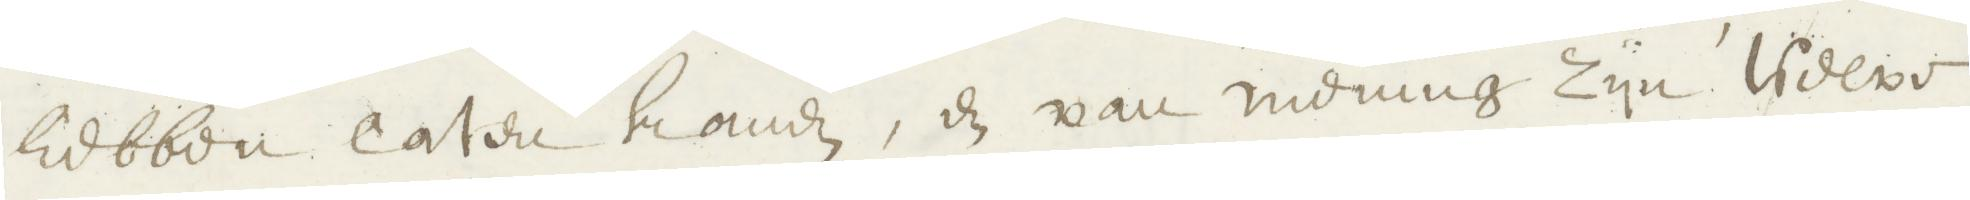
hebben laten komen, en van mening zijn 'tselve
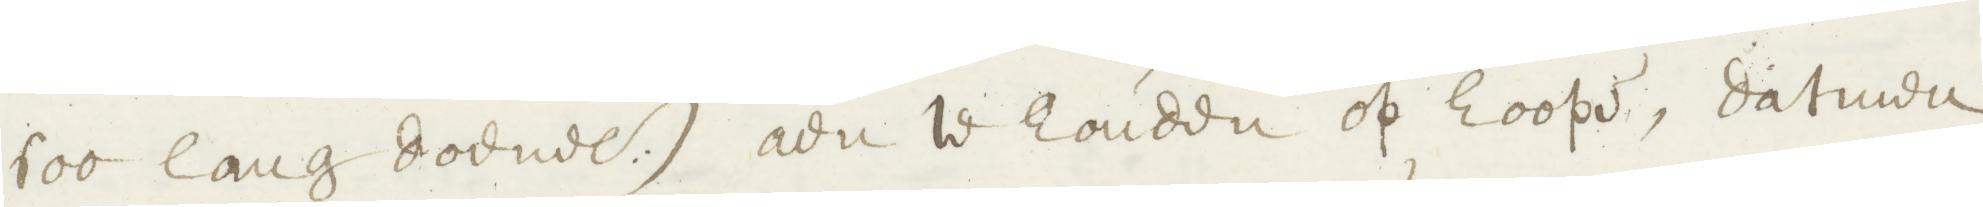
soo lang doenelijk aen te houden op hoope, dat men
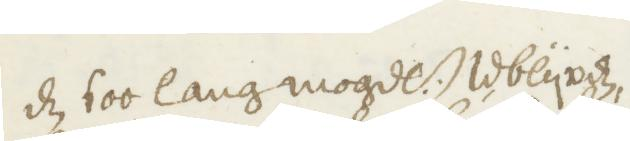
en soo lang mogelijk te blijven,
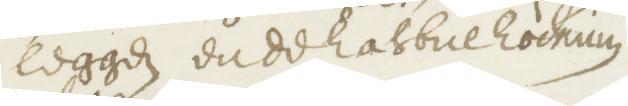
leggen en de hasbul hockum
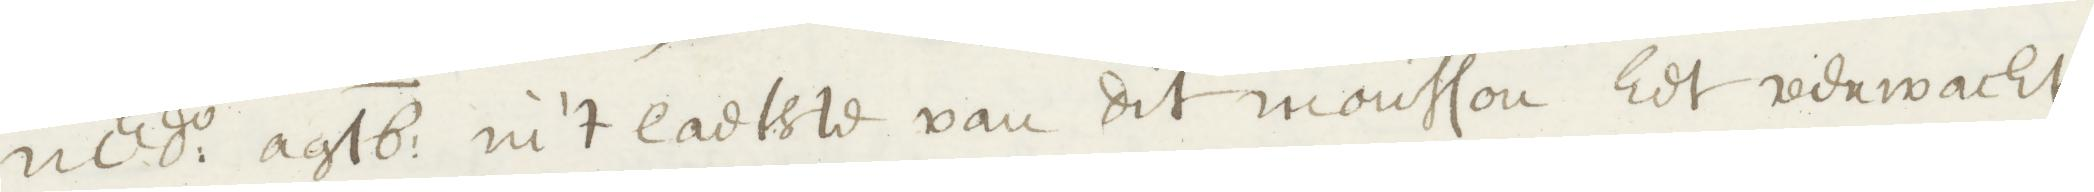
u Ed:e agtb: in ’t laetste van dit mousson het verwacht
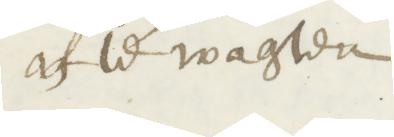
af te wagten
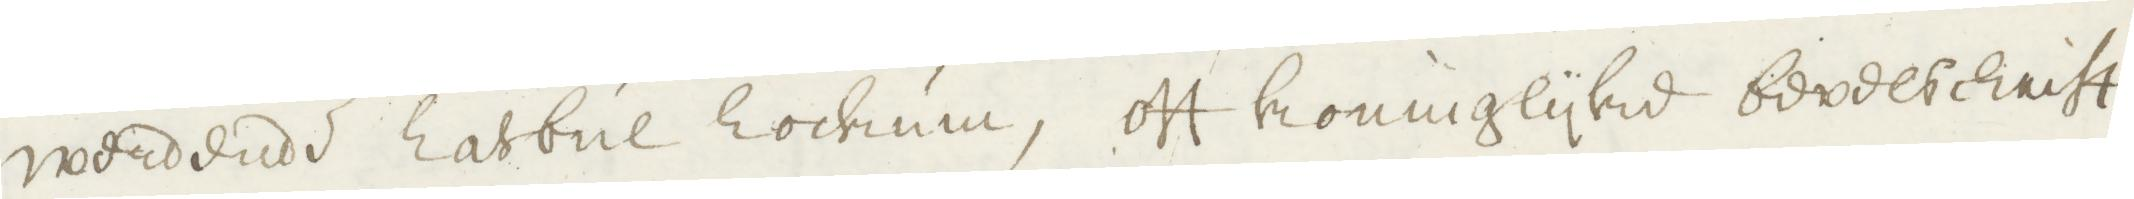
werdende hasbul hockum, off koninglijke bevelschrift
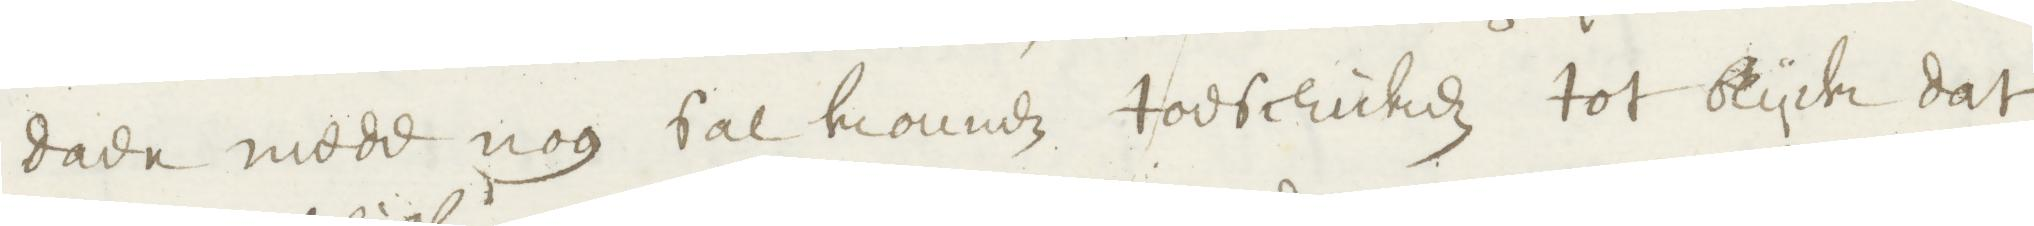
daer mede nog sal konnen toeschicken tot blijck dat
